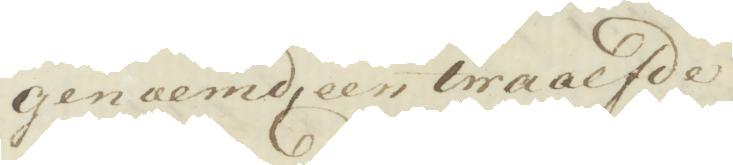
genoemd, een twaalfde
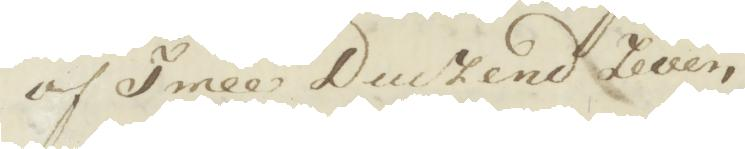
of Twee Duizend Zeven
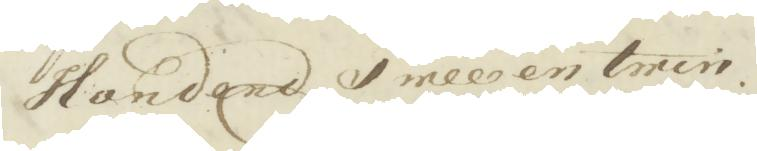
Honderd Twee en twin,
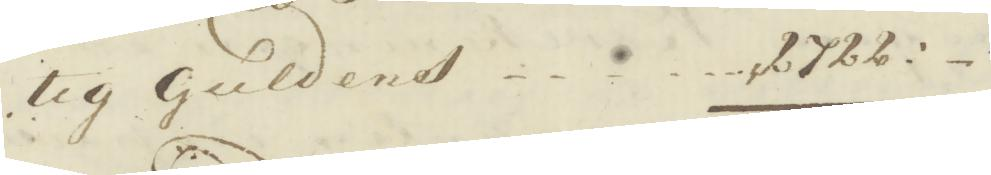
tig Guldens - - - - - - „ 2722: —
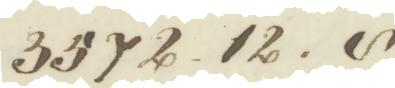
3572. 12. 8
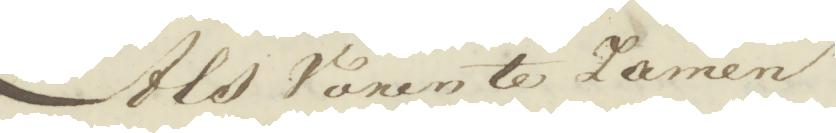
Als Voren te Zamen
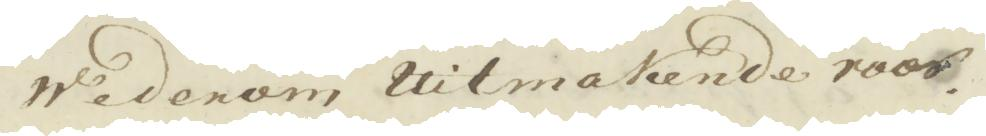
wederom uitmakende voor,
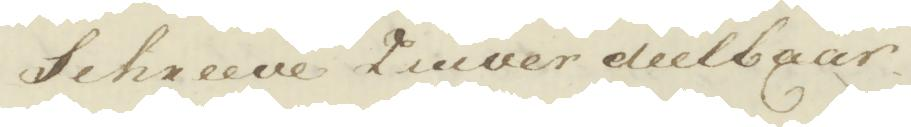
schreeve Zuiver deelbaar
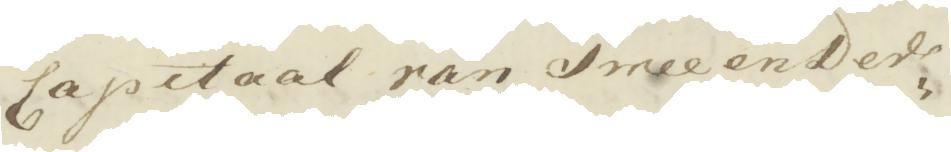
Capitaal van Twee en Der„
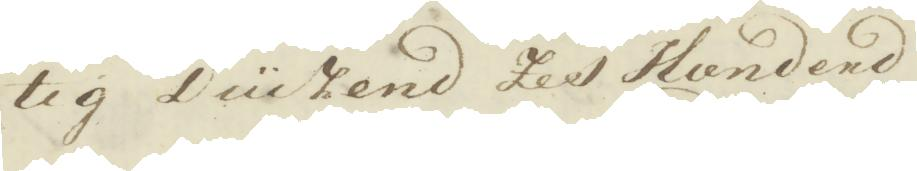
tig Duizend Zes Honderd
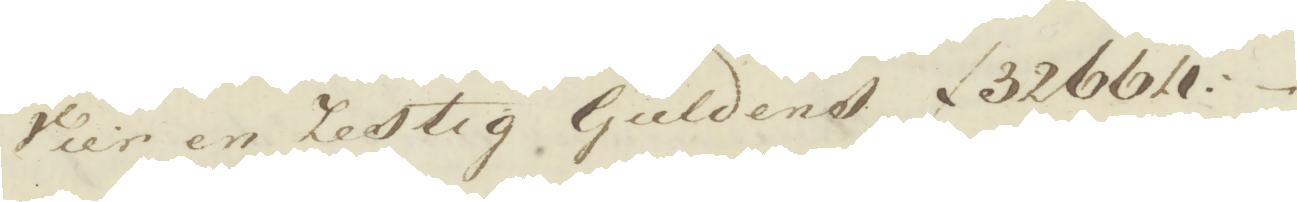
Vier en Zestig Guldens ƒ 32664: —
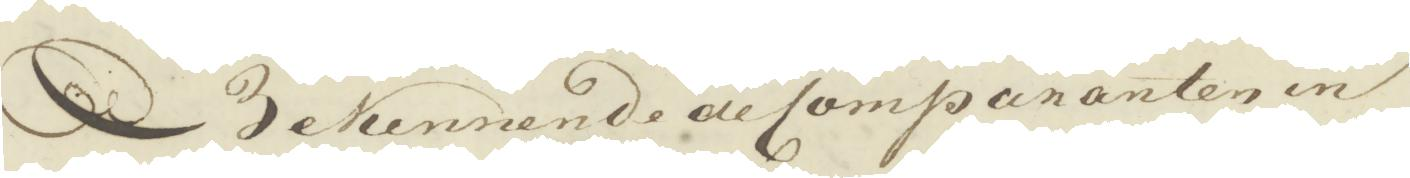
Bekennende de Comparanten in
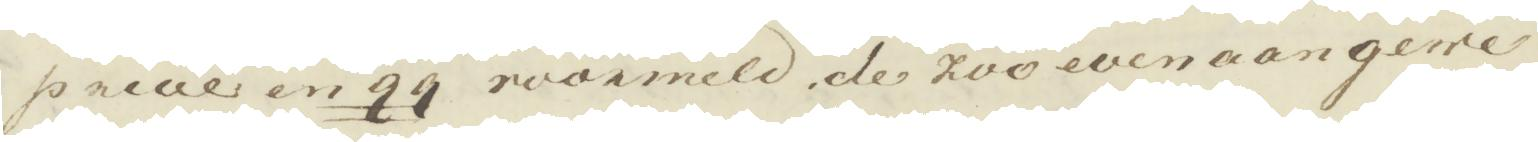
privé en qq voormeld, de zoo even aangewe,
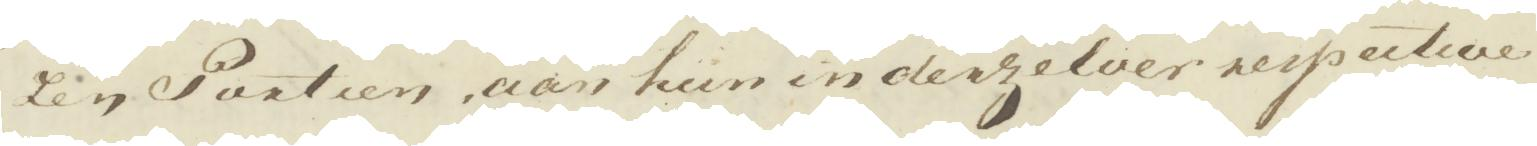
zen Portien, aan hun in derzelver respective
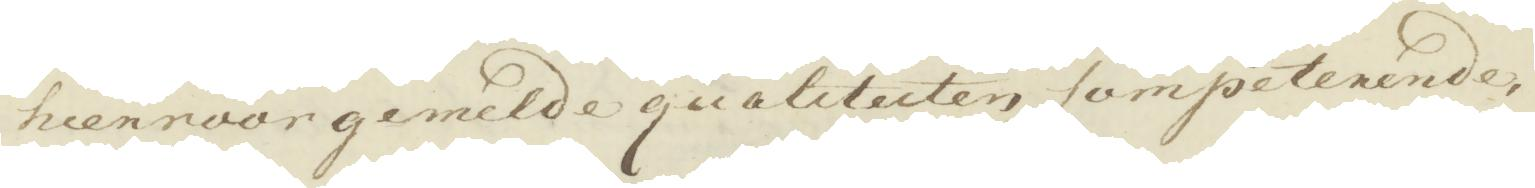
hiervoor gemelde qualiteiten Competerende,
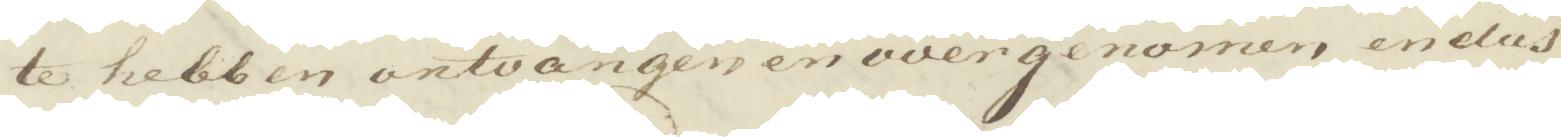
te hebben ontvangen en overgenomen, en dus
